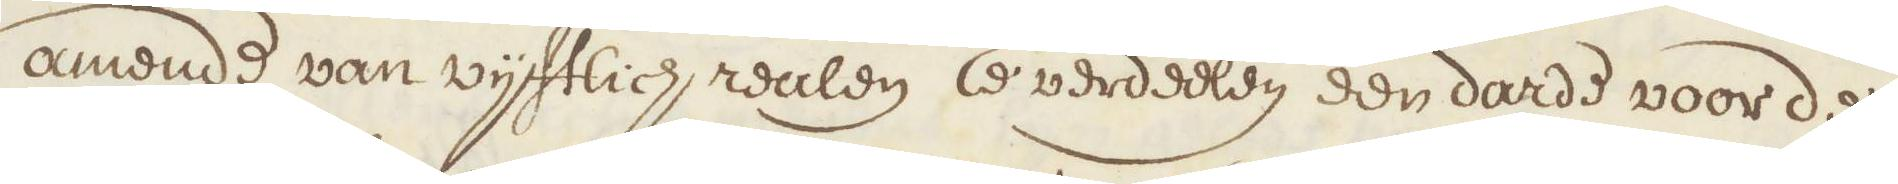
amende van vijfftich realen te verdeelen een darde voor de
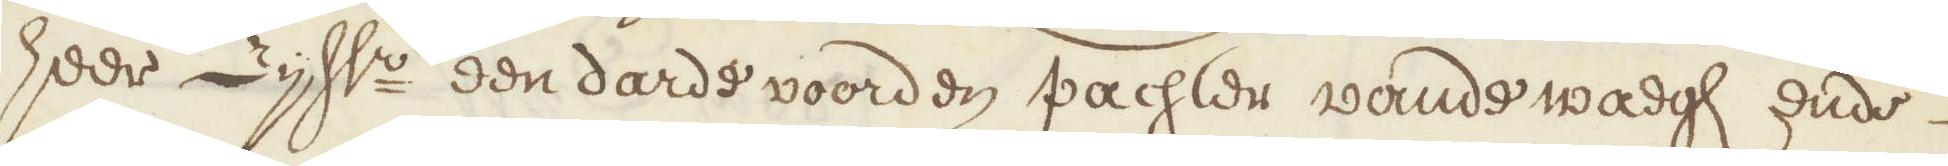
heer Eijss=r een darde voor den pachter vande waegh ende
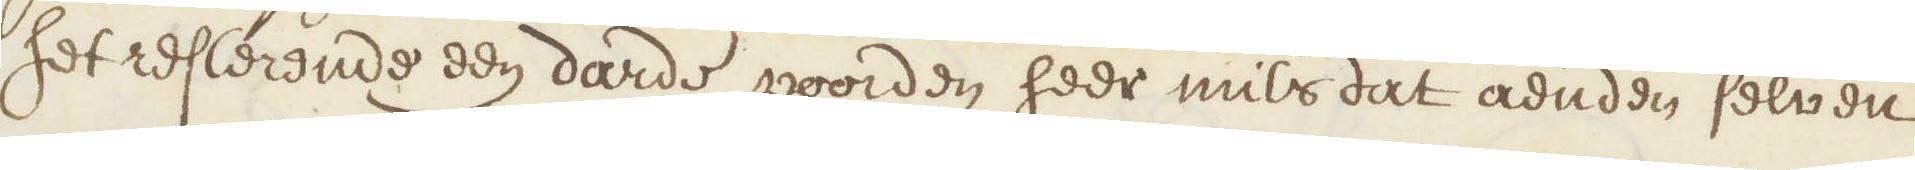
het resterende een darde voorden heer mits dat aen den selven
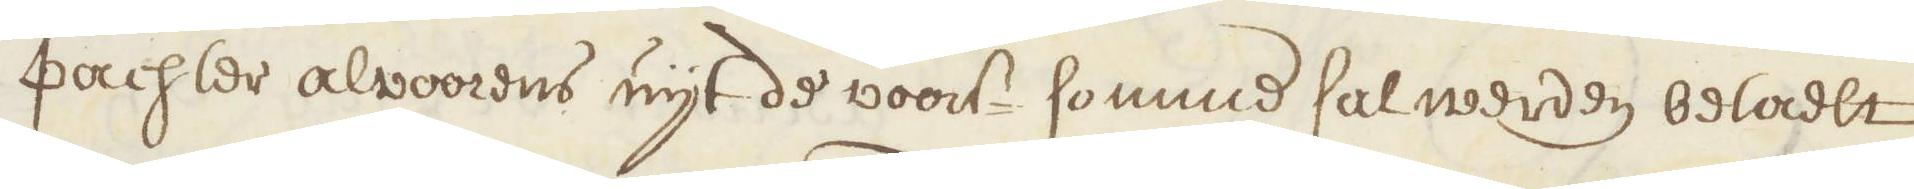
pachter alvoorens uijt de voors=z somme sal werden betaelt
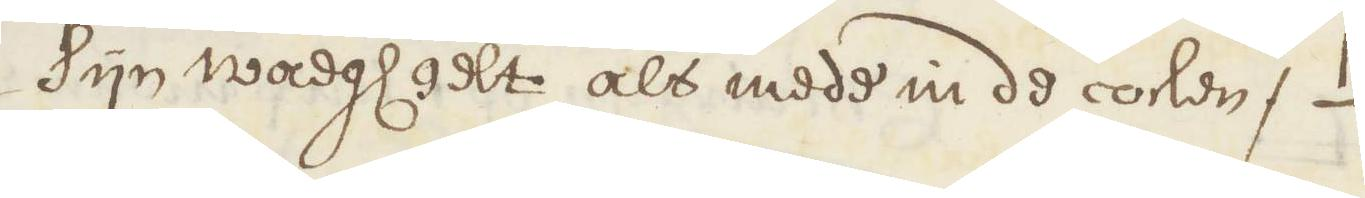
sijn waeghgelt als mede in de costen/ —
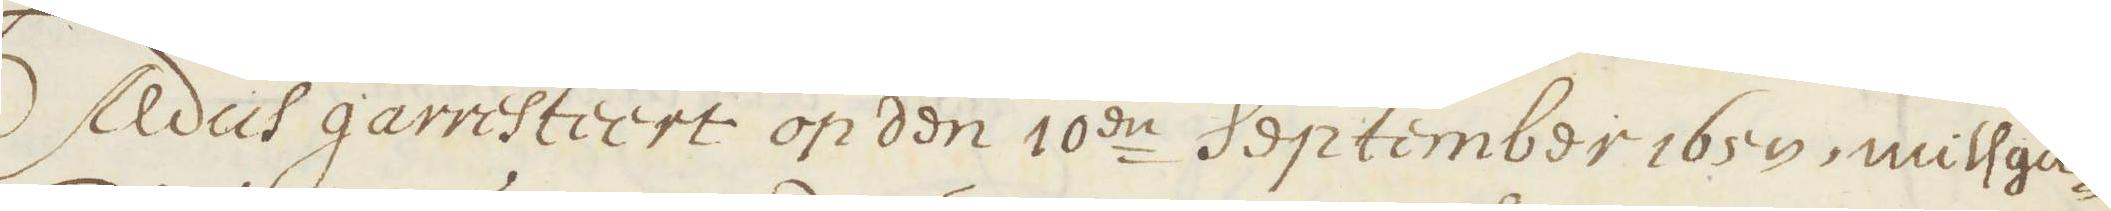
Aldus g’arresteert op den 10=en September 1659, mitsga„
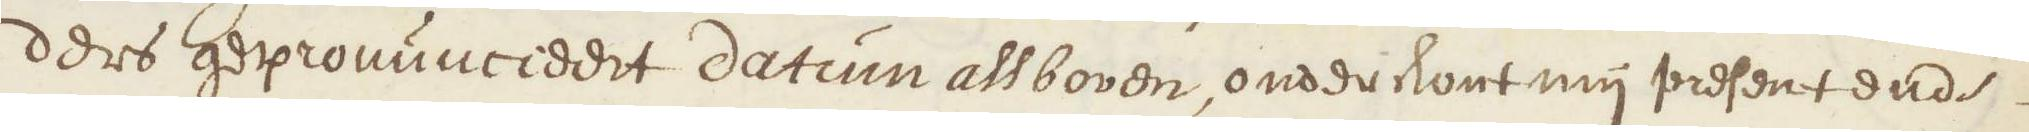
ders gepronuncieert datum als boven, onderstont mij present ende
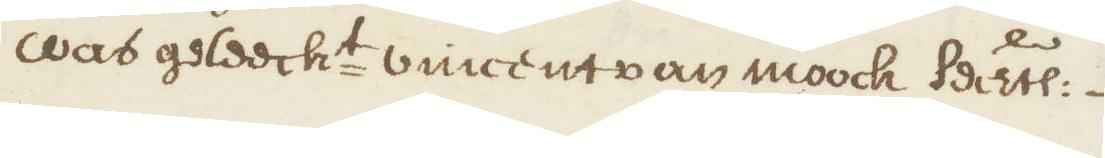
was geteeck=t vincent van moock secrts:-
